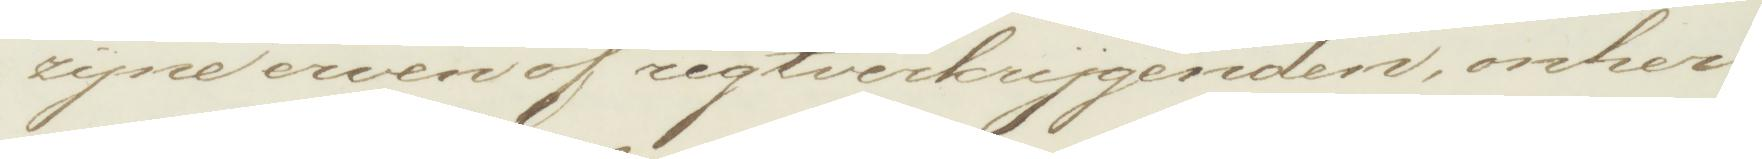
zijne erven of regtverkrijgenden, onher
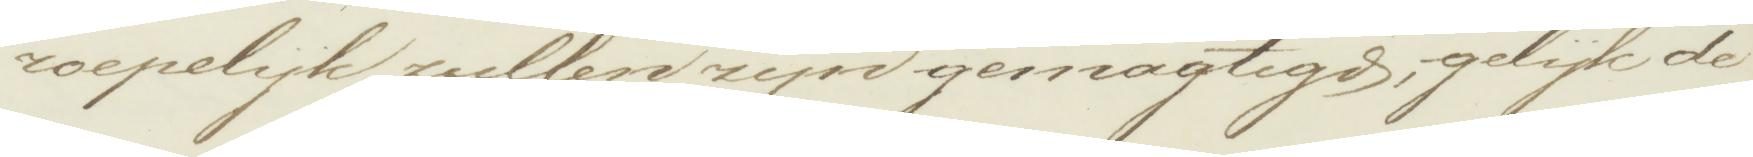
roepelijk zullen zijn gemagtigd, gelijk de
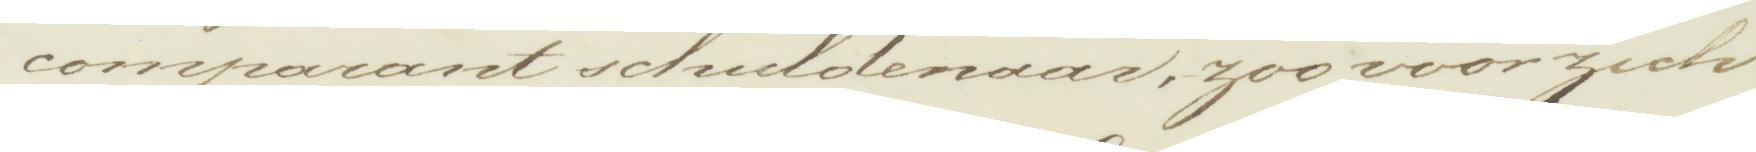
comparant schuldenaar, zoo voor zich
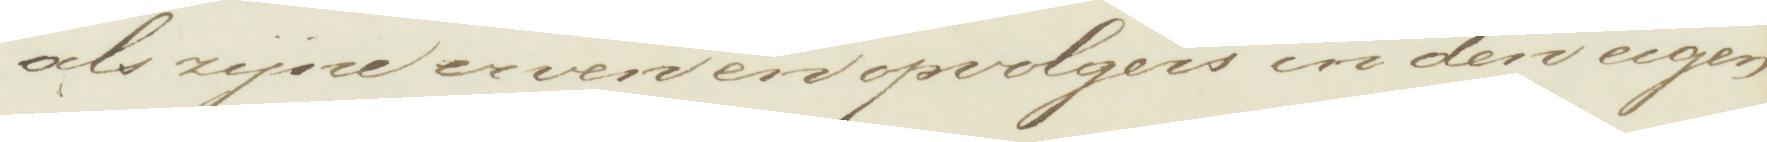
als zijne erven en opvolgers in den eigen
